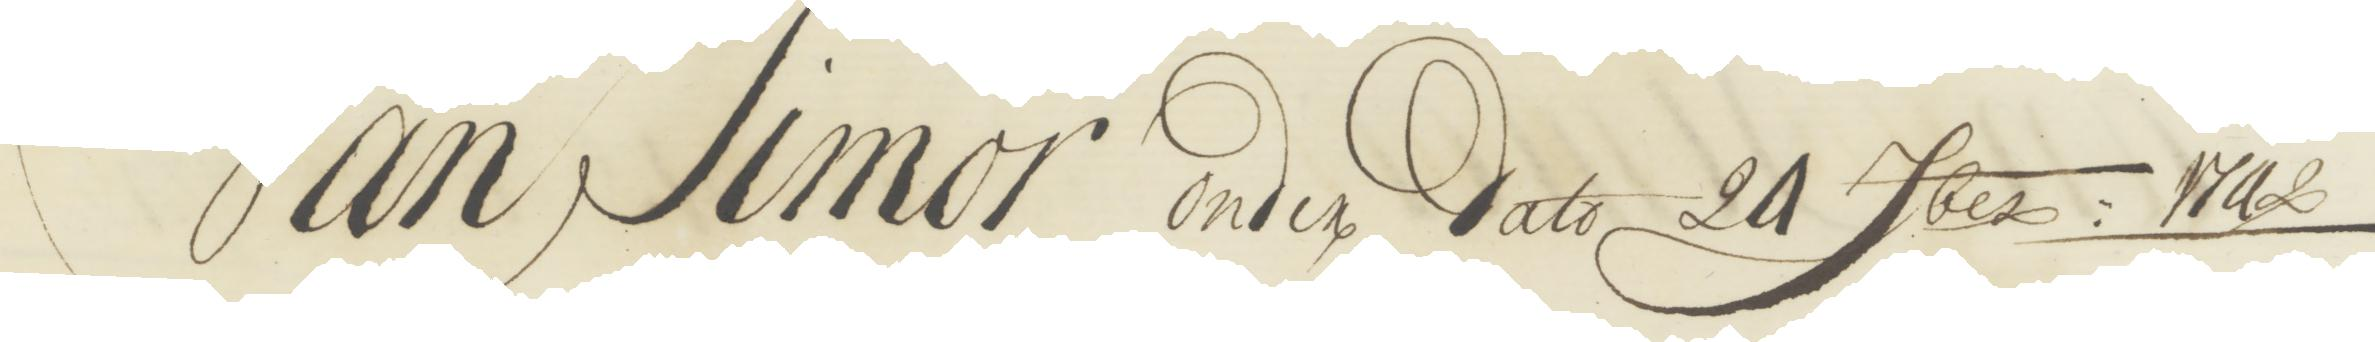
Van Timor onder dato 24 Jber: 1742
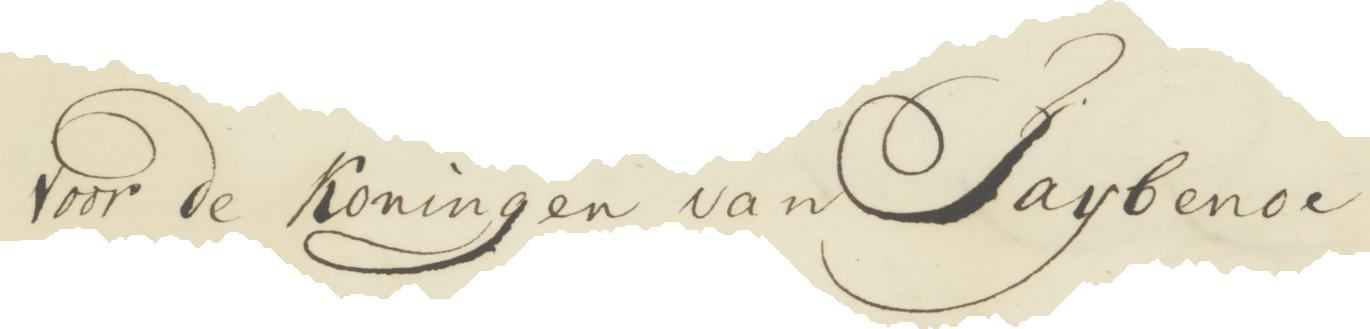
voor de koningen van Taybenoe
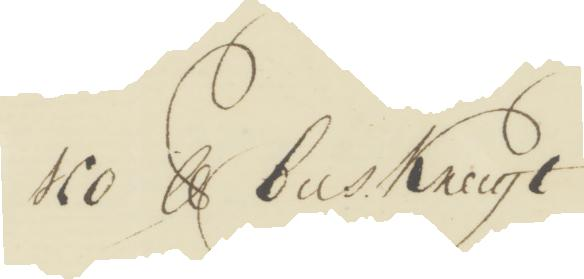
150 lb buskruyt
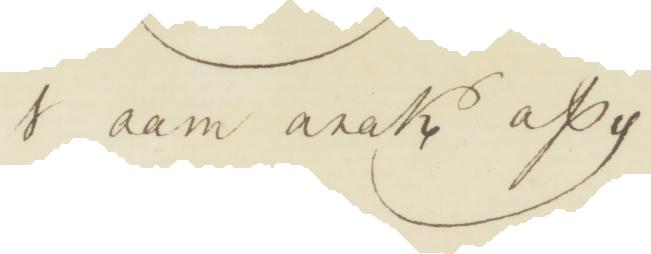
1 aam arak apy
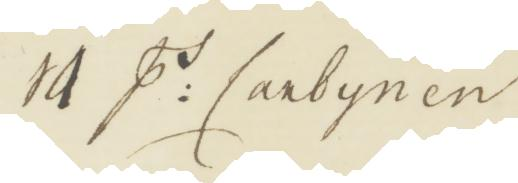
14 p:s Carbynen
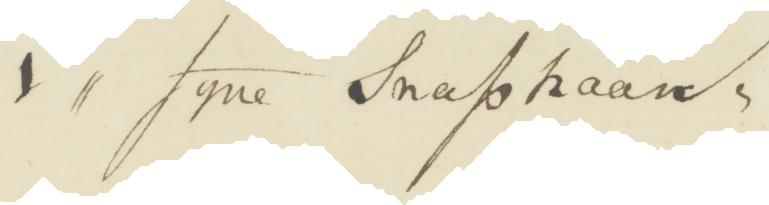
1 „ fyne snaphaan en
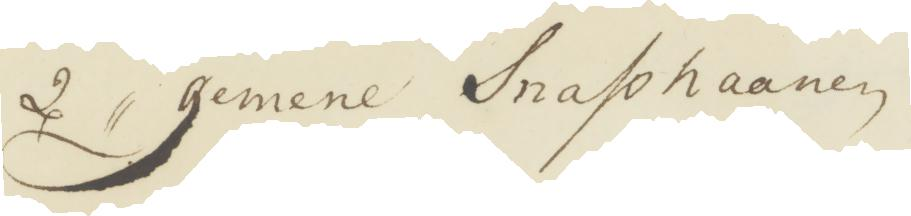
2 „ gemene snaphaanen
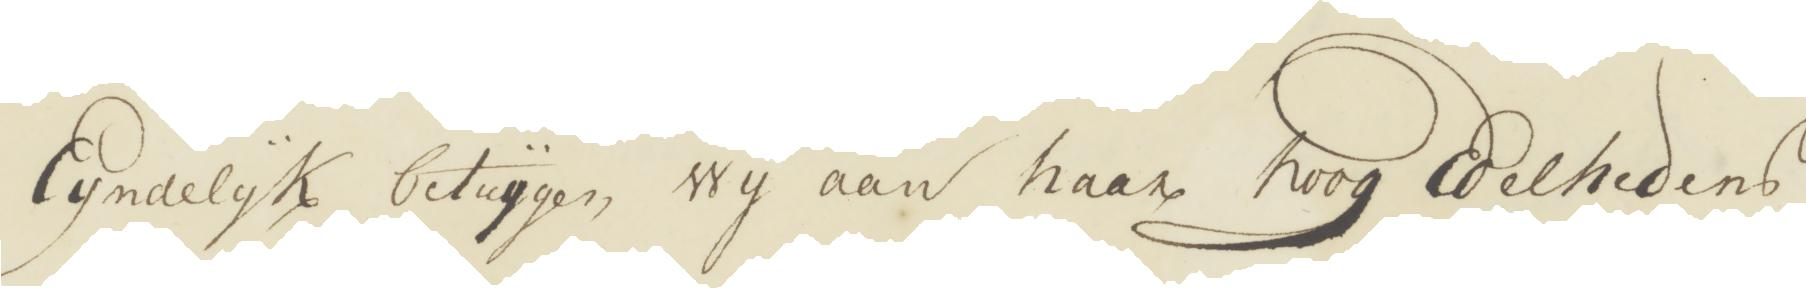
Eijndelijk betuijgen wy aan haar hoog Edelhedens
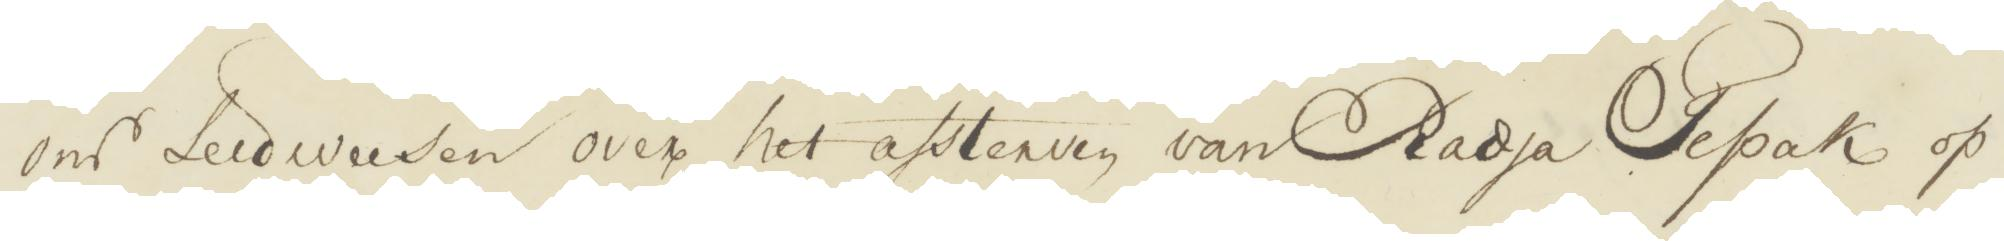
ons leedweesen over het afsterven van Radja Tepak op
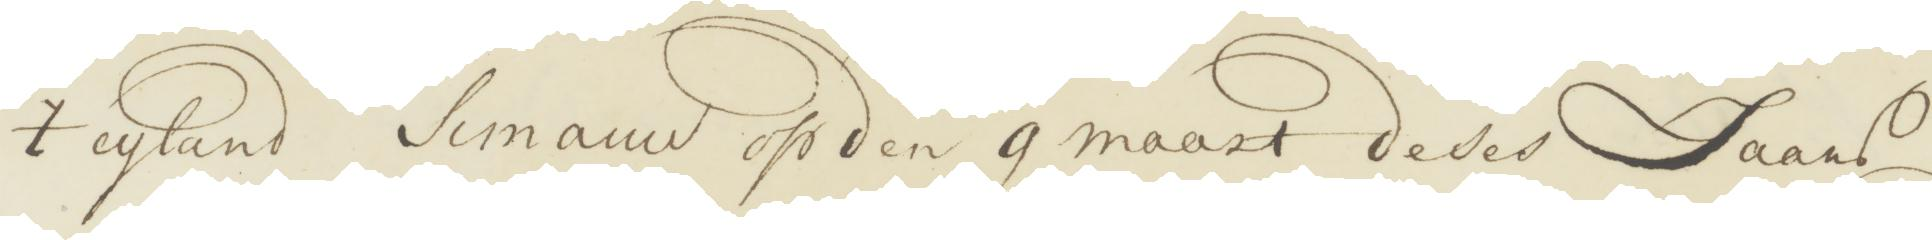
’t eyland simauw op den 9 maart deses Iaars
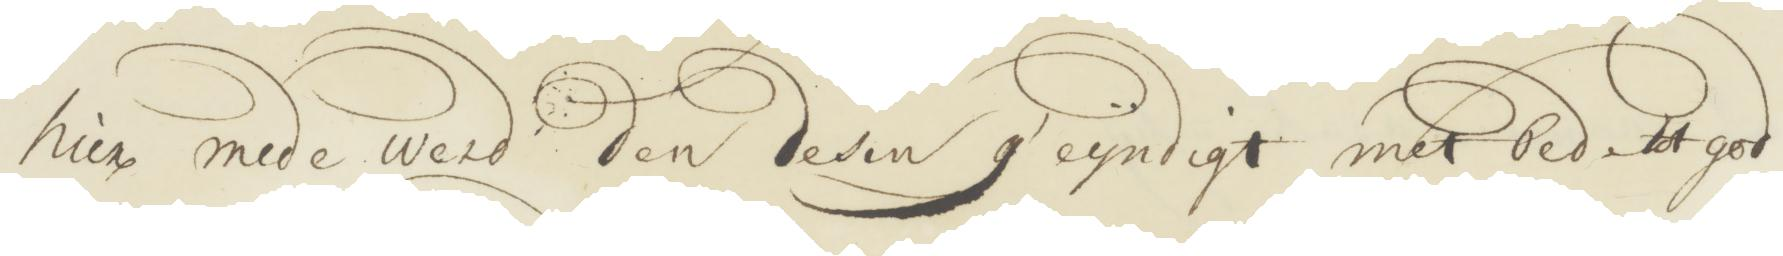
hier mede werd den desen g’ eijndigt met bede tot god
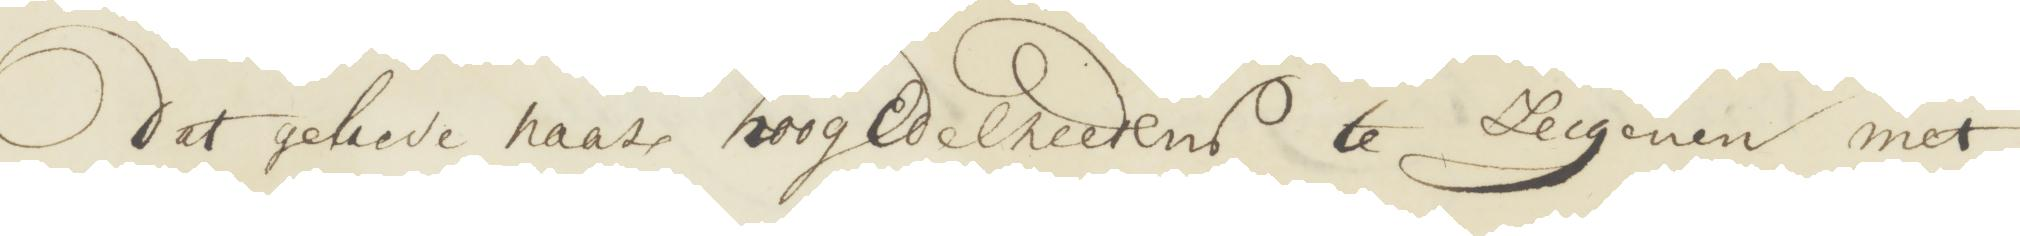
dat gelieve haar hoog Edelheedens te zeegenen met
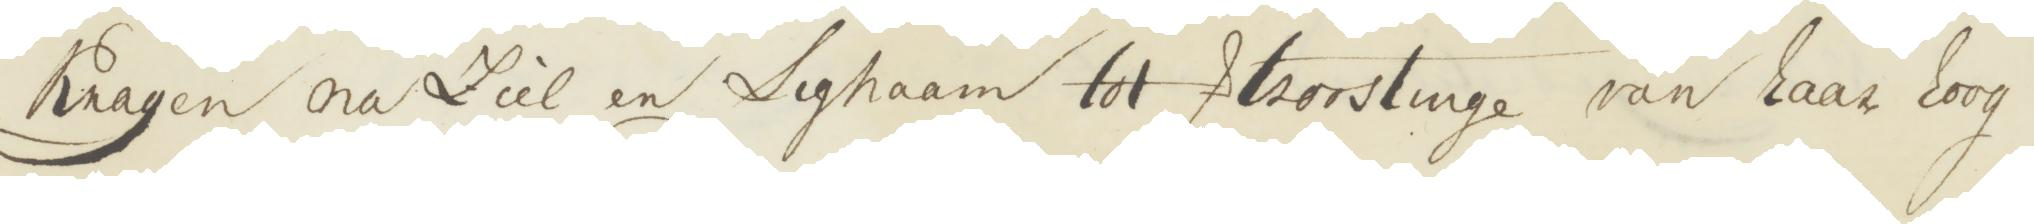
krag en na ziel en sighaam tot vertroostinge van haar hoog
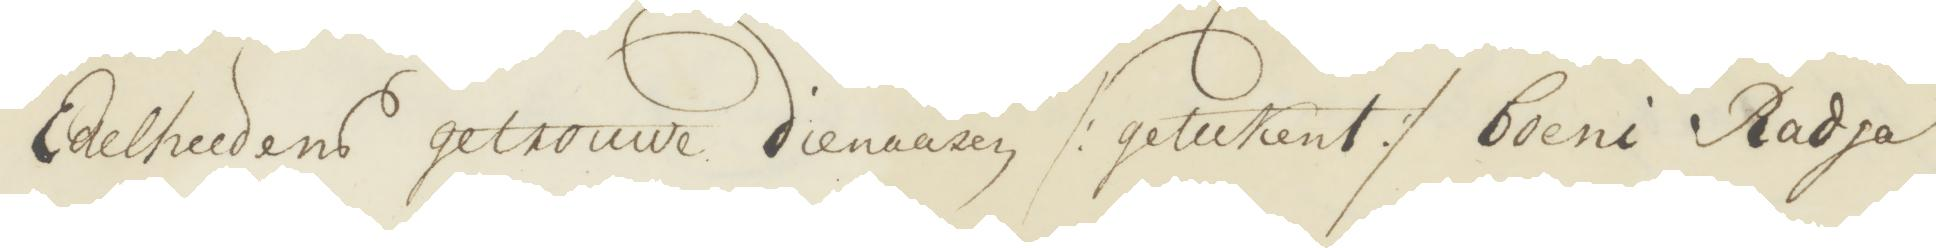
Edelheedens getrouwe dienaaren /:geteekent:/ boeni Radja
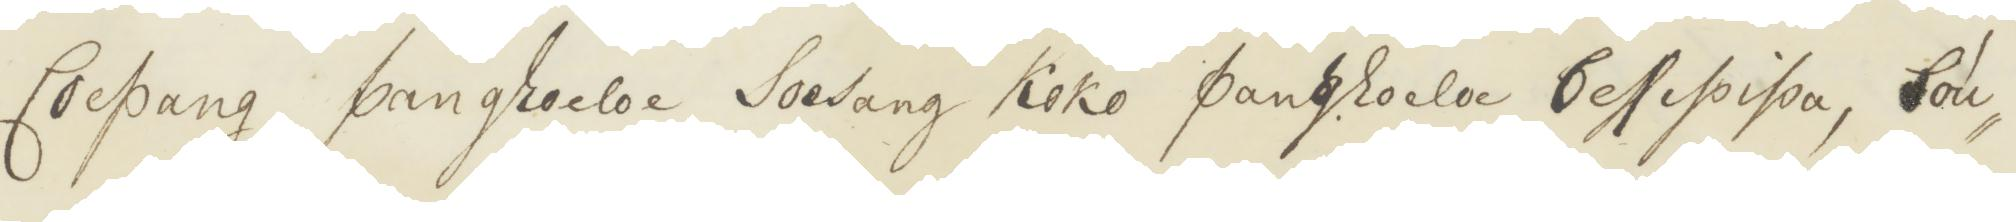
Coepang, panghoeloe soesang koko panghoeloe bessipipa, sou„
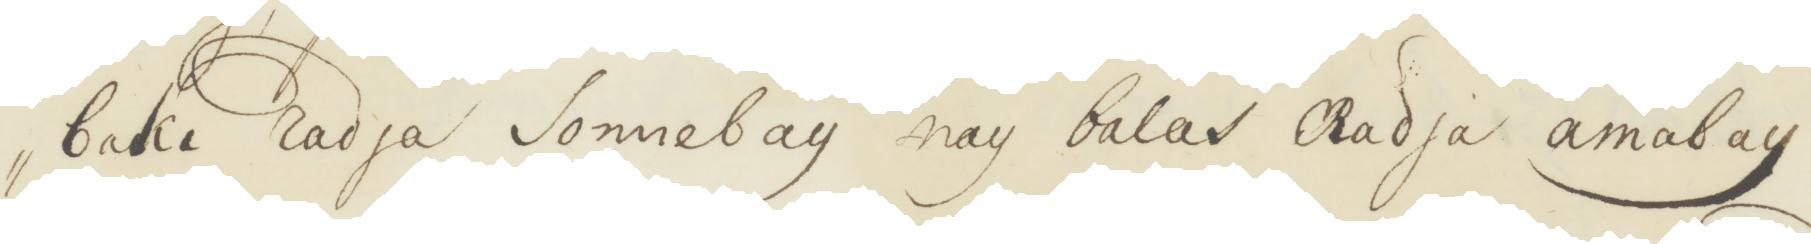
„bake radja sonnebay nay balas Radja amabay
